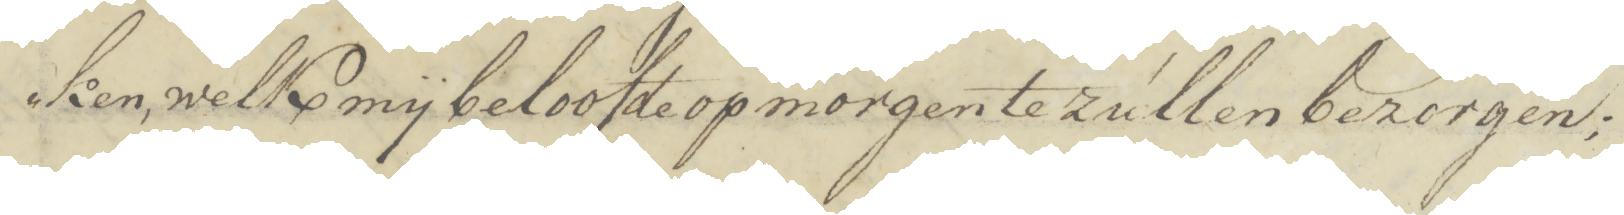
ken, welk mij beloofde op morgen te zullen bezorgen;
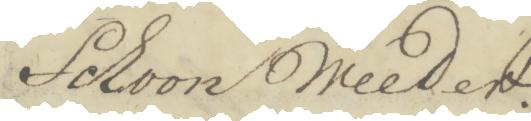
schoon weeder.
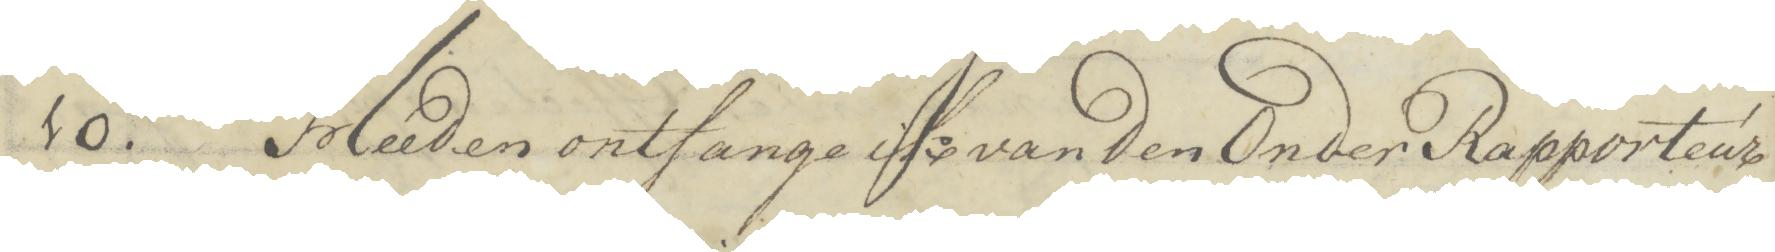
10. Heeden ontfange ik van den Onder Rapporteur
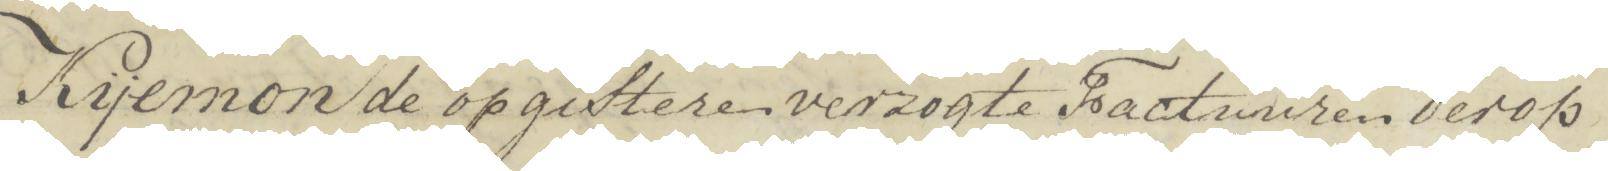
Kijemon de op gisteren verzogte Factuuren derop
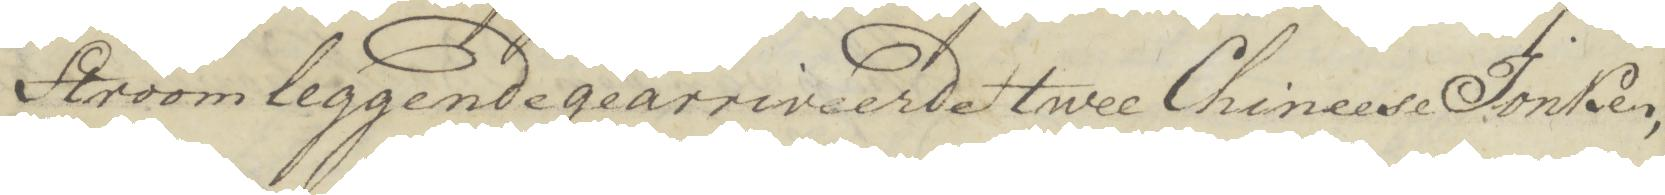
stroom leggende gearriveerde twee Chineese Ionken,
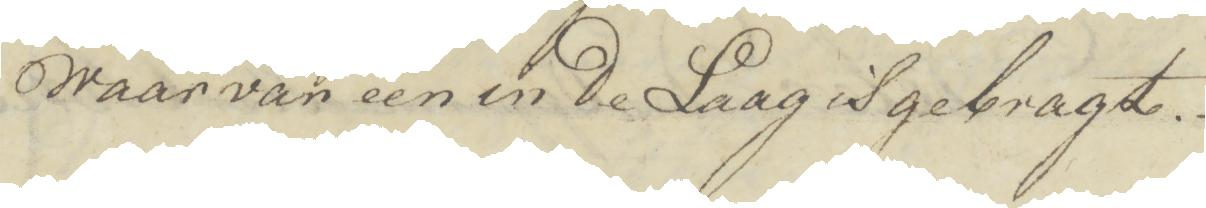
waar van een in de Laag is gebragt.
